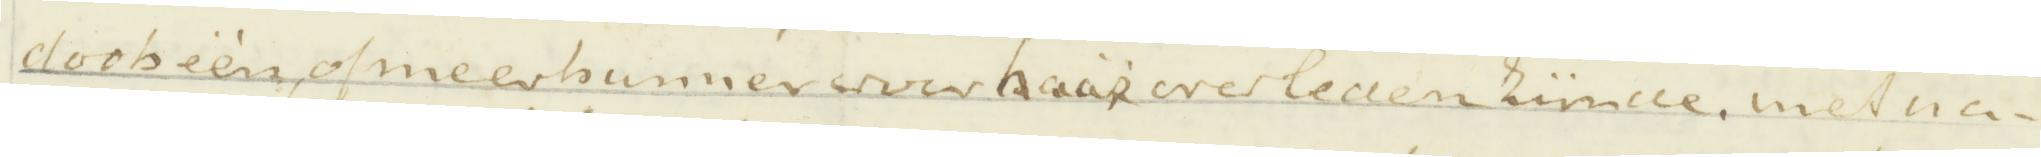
doch èèn of meer hunner voor haar overleden zijnde, met na-
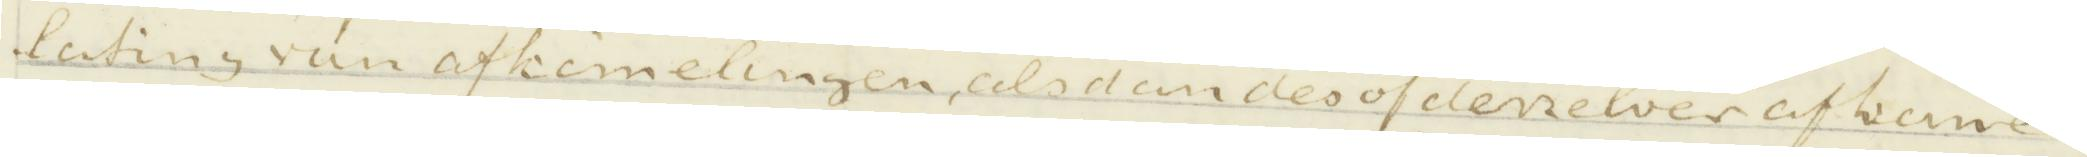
lating van afkomelingen, als dan des of derzelver afkome-
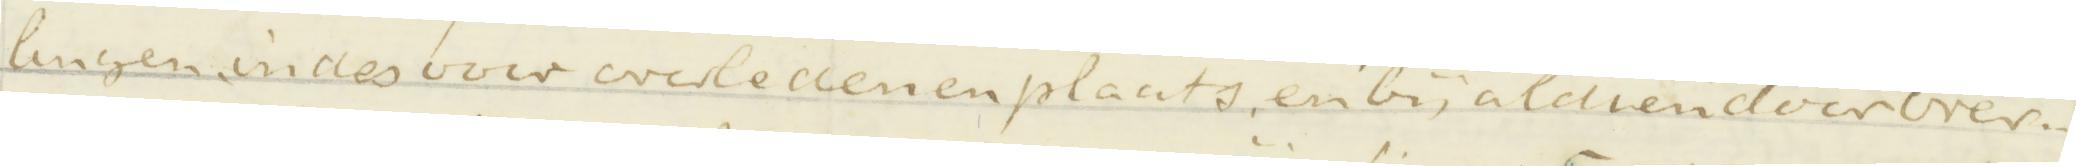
lingen in des voor overledenen plaats, en bij aldien door over.-
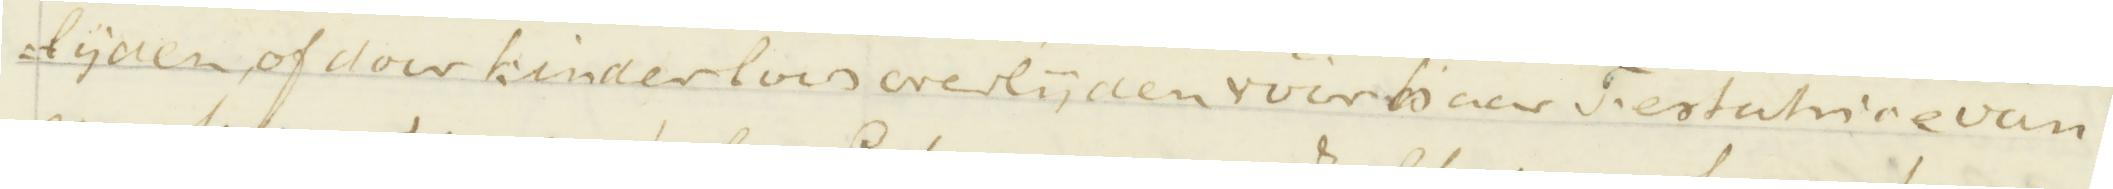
=lijden, of door kinderloos overlijden vòòr haar Testatrice van
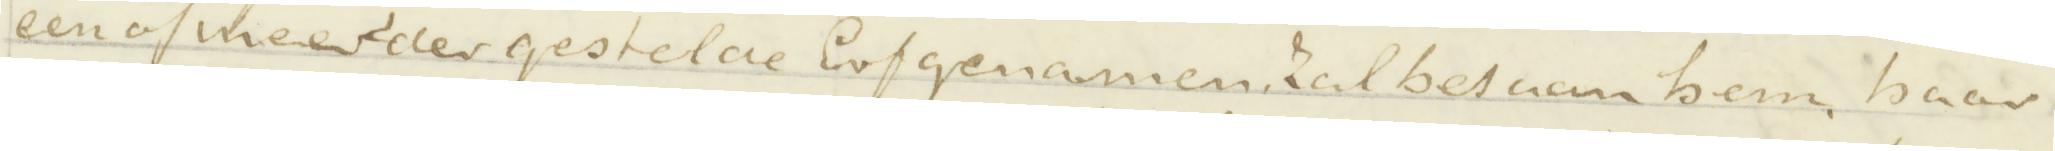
een of meerder gestelde Erfgenamen, zal het aan hem, haar
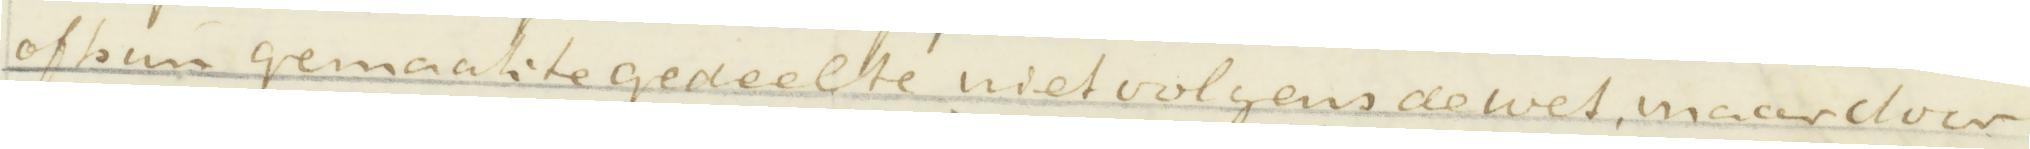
of hun gemaakte gedeelte niet volgens de wet, maar door
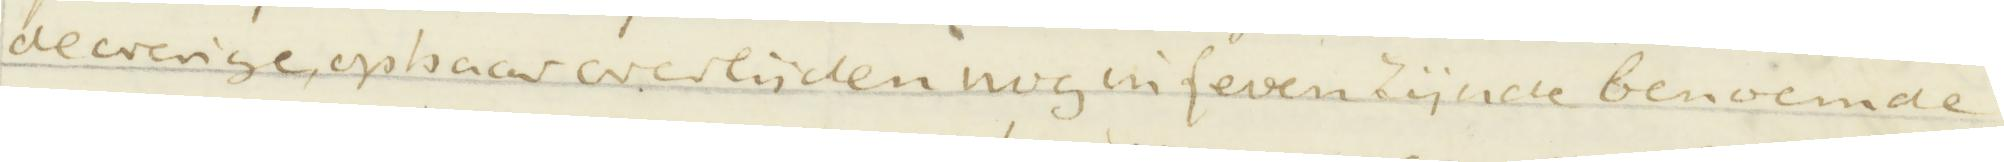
de overige op haar overlijden nog in leven zijnde benoemde
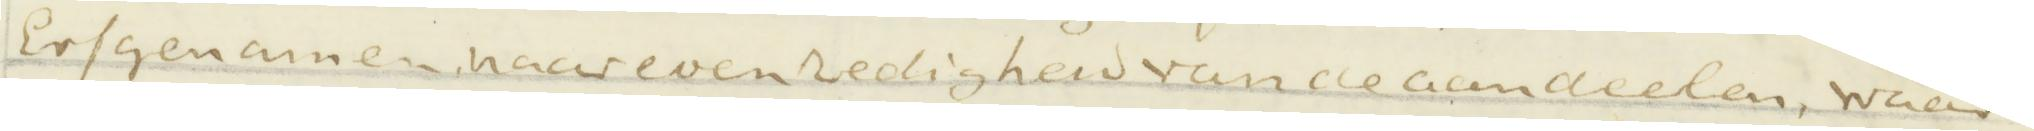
Erfgenamen naar evenredigheid van de aandeelen waar
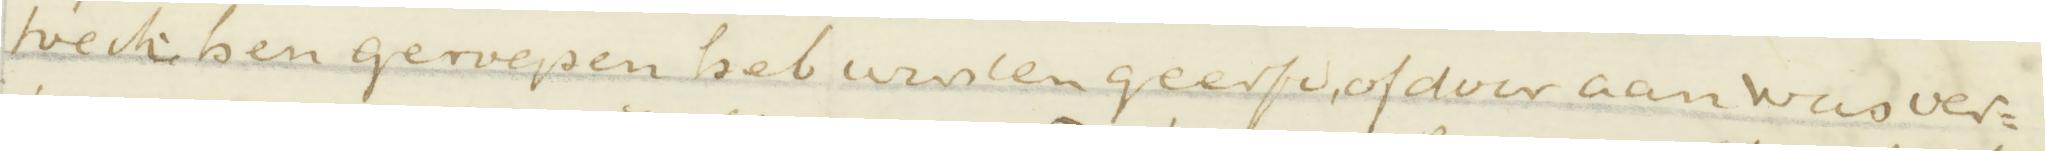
toe ik hen geroepen heb worden geerfd, of door aan was ver=
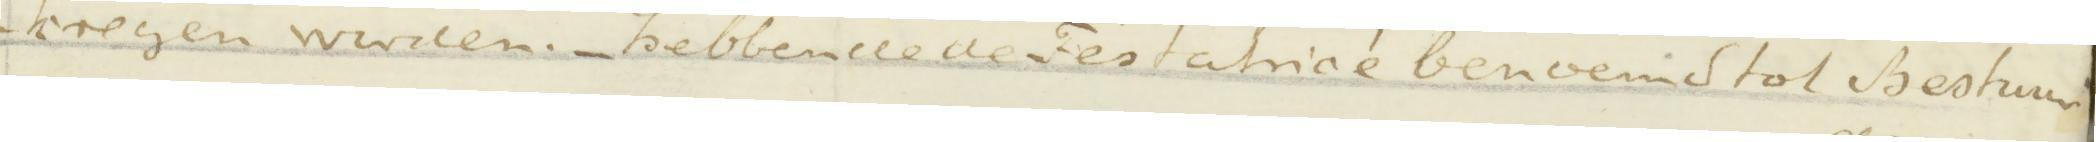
kregen worden. – hebbende de Testatrice benoemd tot Bestuur
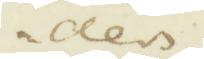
=ders
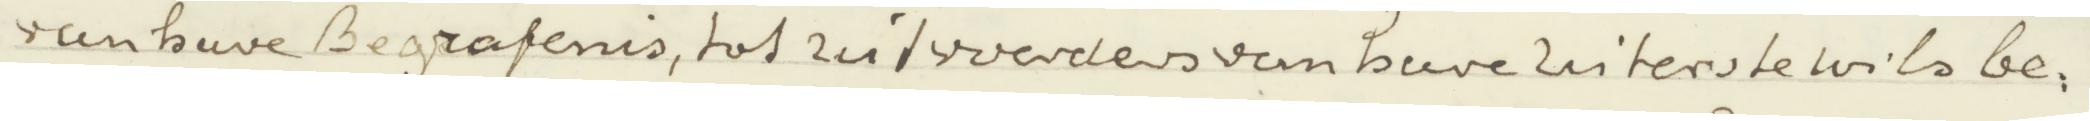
van hare Begrafenis, tot uitvoerders van hare uiterste wils be:
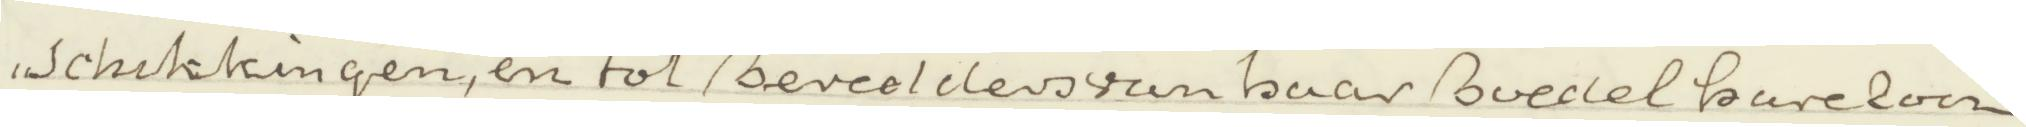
„schikkingen, en tot Beredders van haar Boedel hare zoon
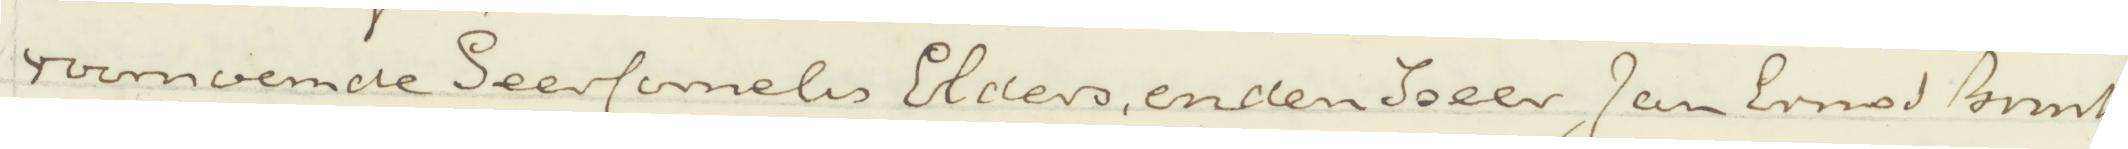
voornoemde heer Cornelis Elders, en den Heer Jan Ernst Brink
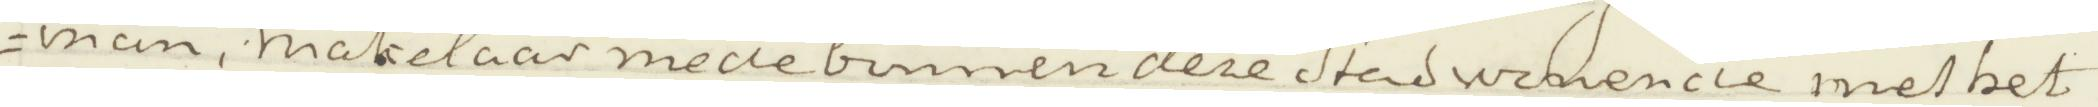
=man, makelaar mede binnen deze stad wonende met het
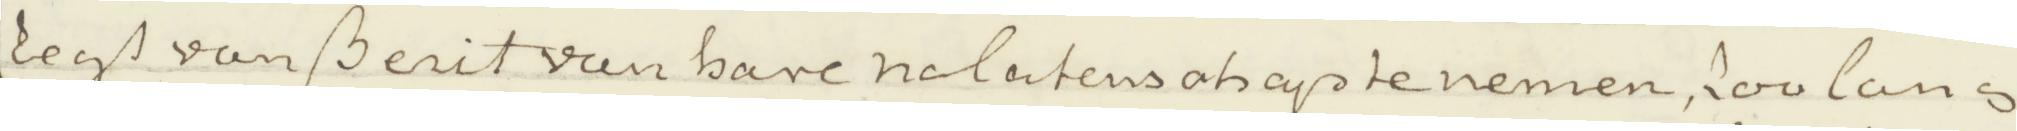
regt van Bezit van hare nalatenschap te nemen, zoolang
